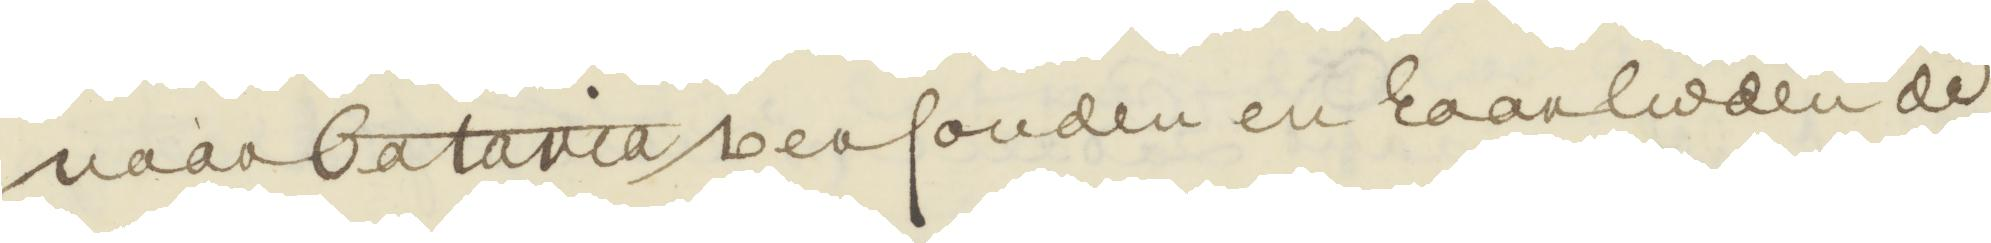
naar batavia versonden en haarlieden de
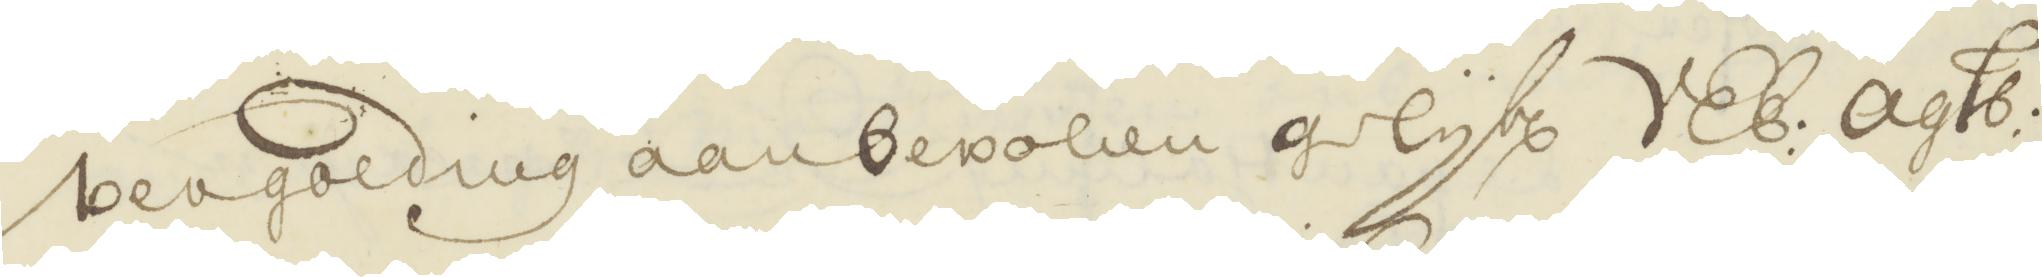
vergoeding aanbevolen gelijk UEE: agtb.
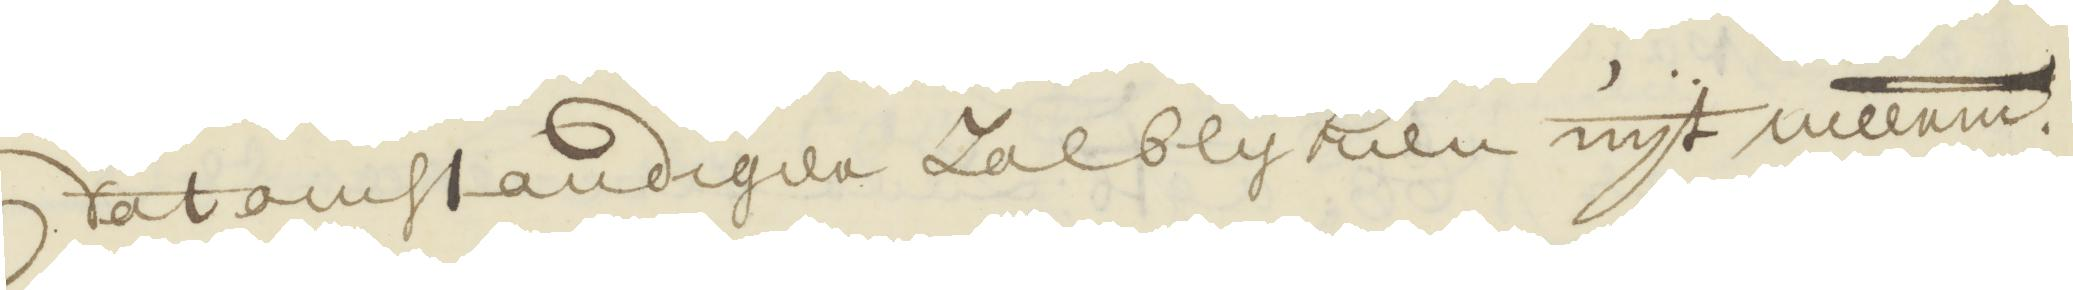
dat omstandiger zal blijken uijt meerm:
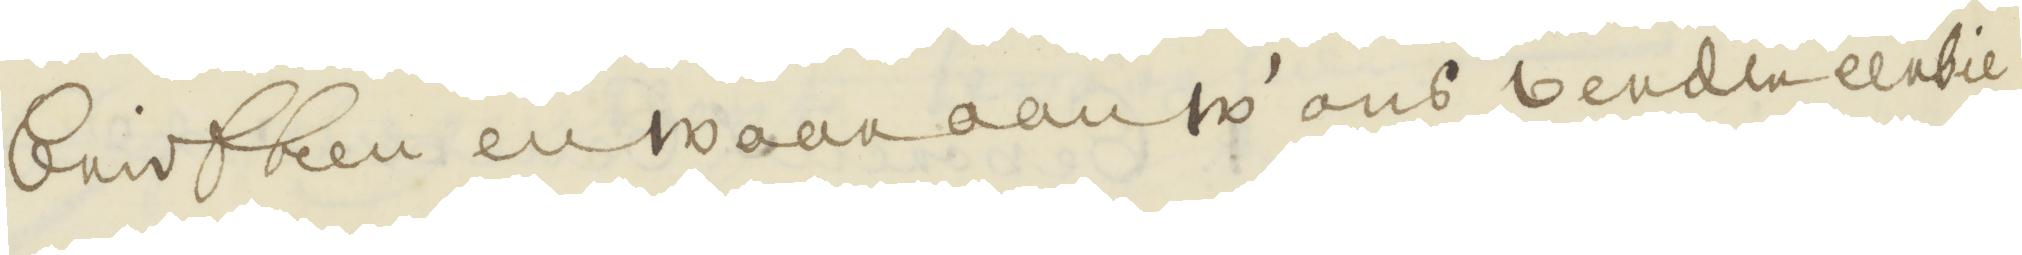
briefken en waar aan w' ons verder eerbie
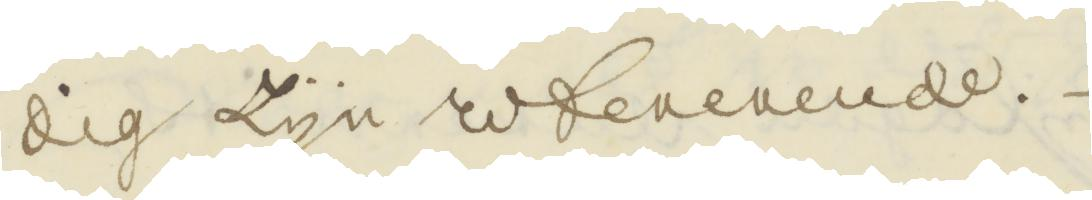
dig zijn refererende.
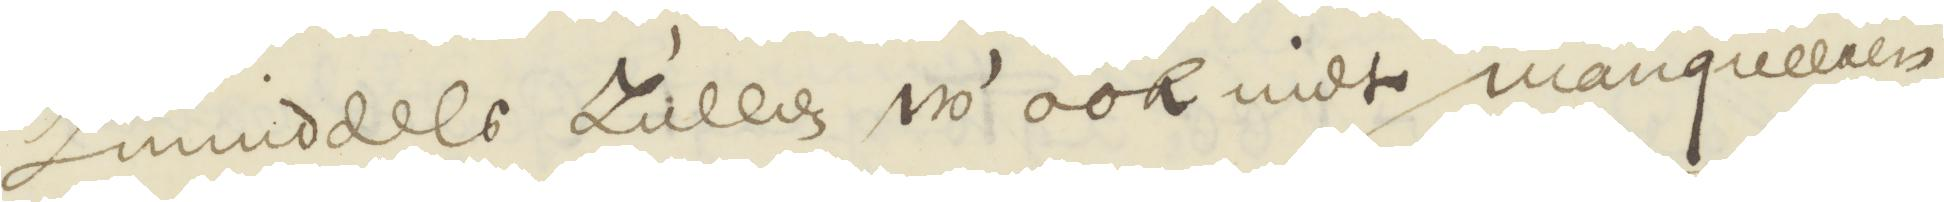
Jnmiddels zullen w' ook niet manqueeren
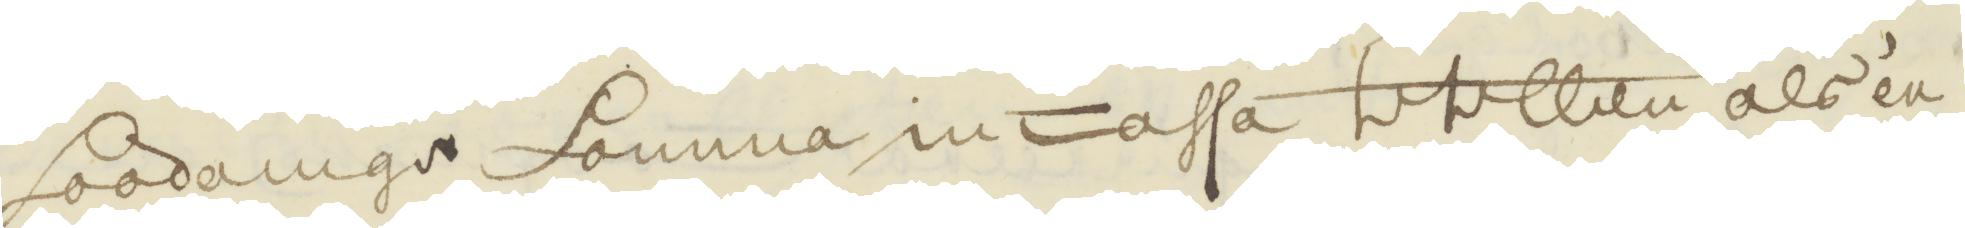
soodanige somma in Cassa te tellen als 'er
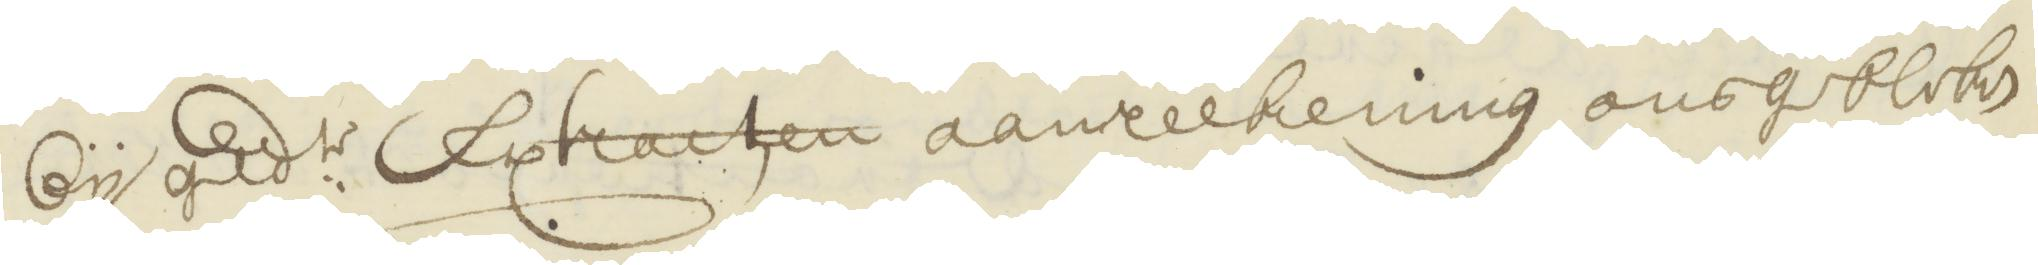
bij ged:te Extracten aanreekening ons gebleken
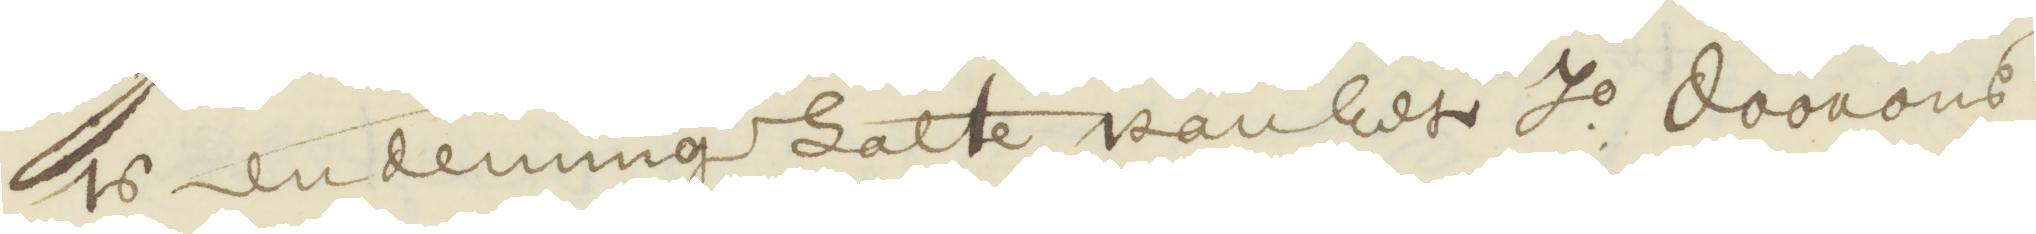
is en denn ingehalte van het J:o door ons
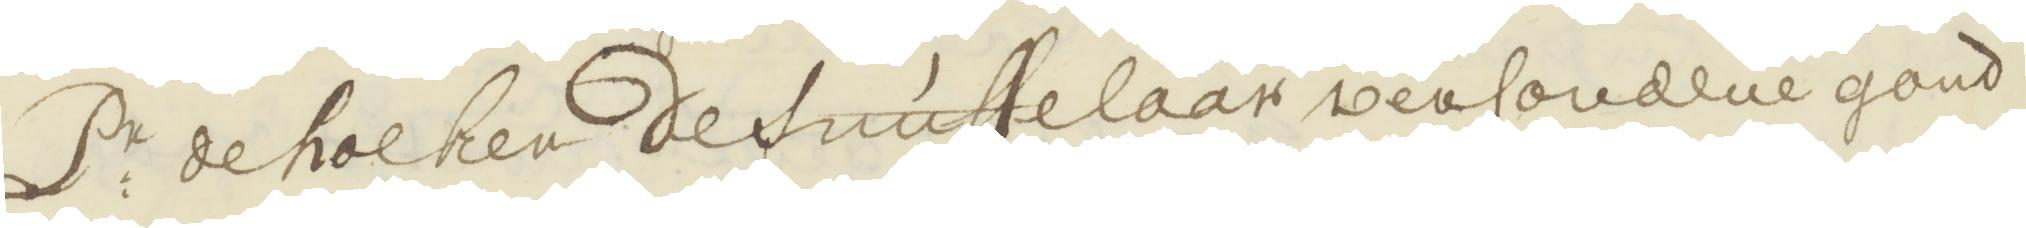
P=r de hoeker de snuffelaar versondene goud
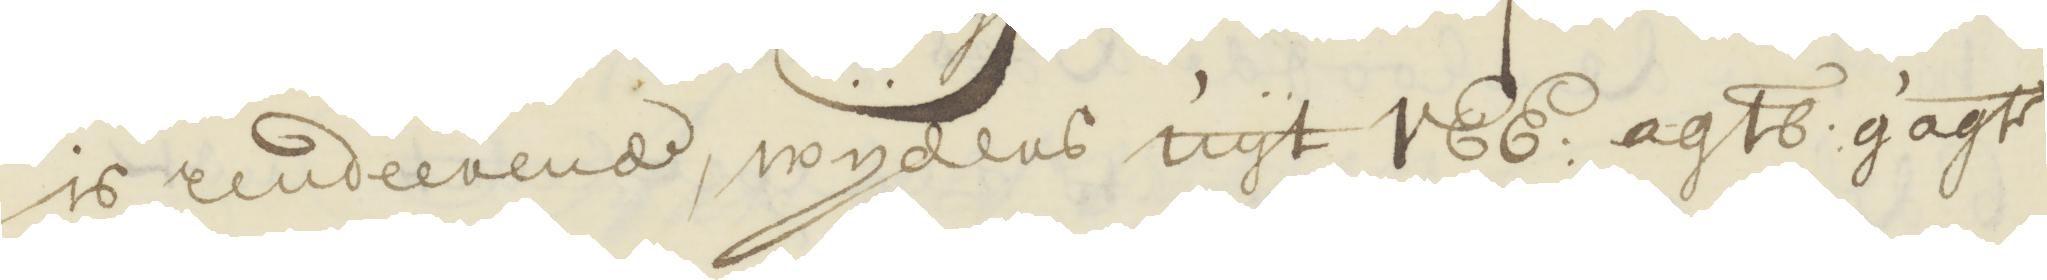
is rendeerende, wijders uijt UEE: agtb: g'agte
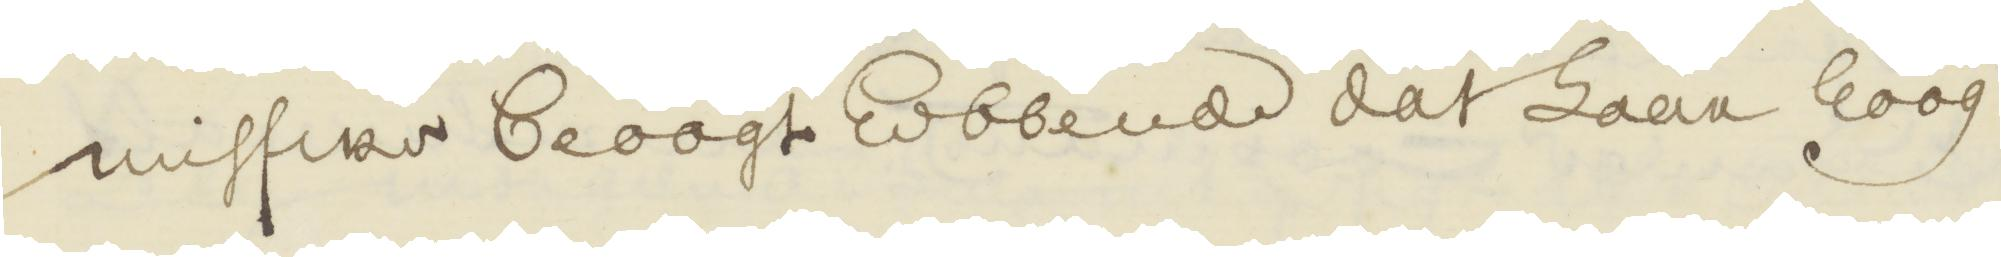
missive beoogt hebbende dat haar hoog
